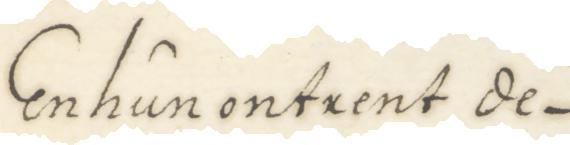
En hun ontrent de –
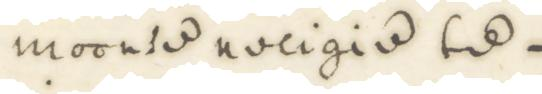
moorse religie te –
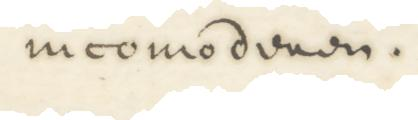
incomoderen.
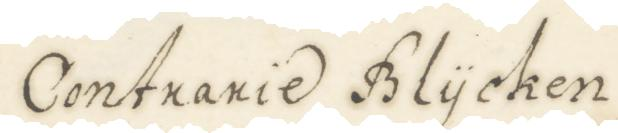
Contrarie Blijcken
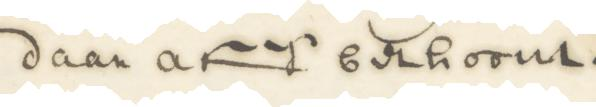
daar aft bethoont.
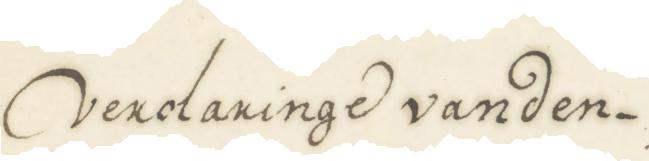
Verclaringe van den -
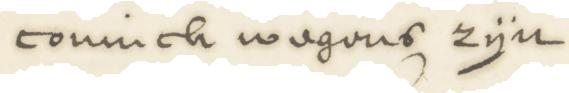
coninck wegens zijn
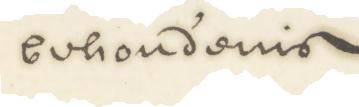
behoudenis.
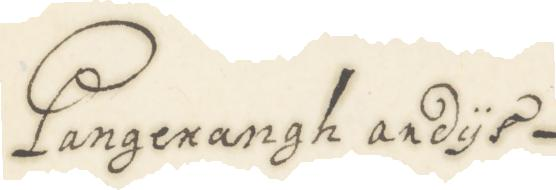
Langerangh ardijs –
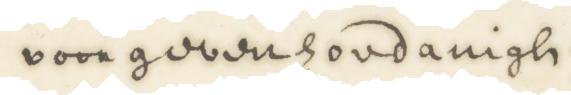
voor geven hoedanigh
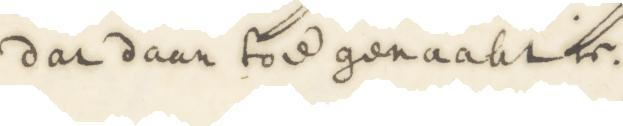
dat daar toe geraakt is.
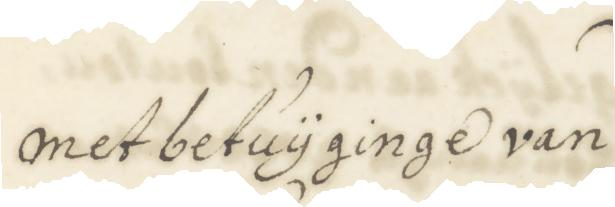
met betuijginge van
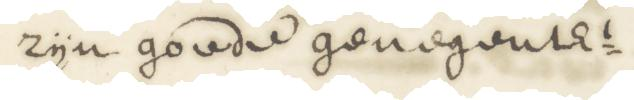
zijn goede genegenth=t
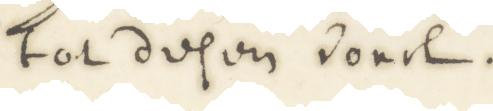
tot desen vorst.
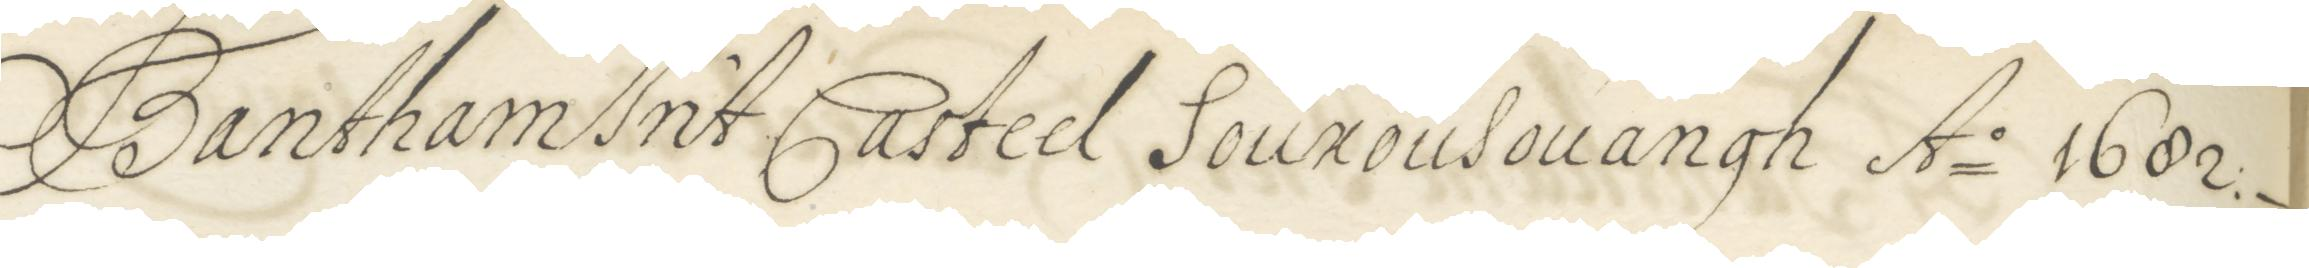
Bantham In’t Casteel Sourousouangh A=o 1682: –
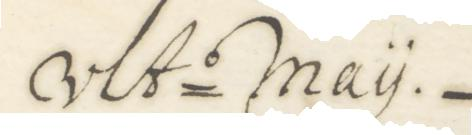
vlt=o Maij. –
